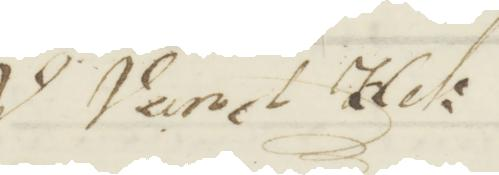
P Van t Hek
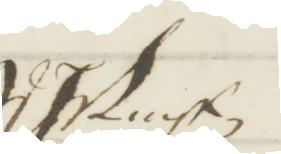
W J v Luyk
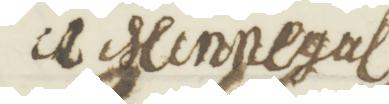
a Minnegal
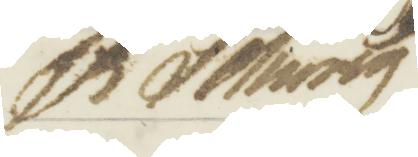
B Schuring
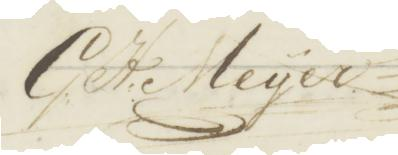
G.H. Meijer.
